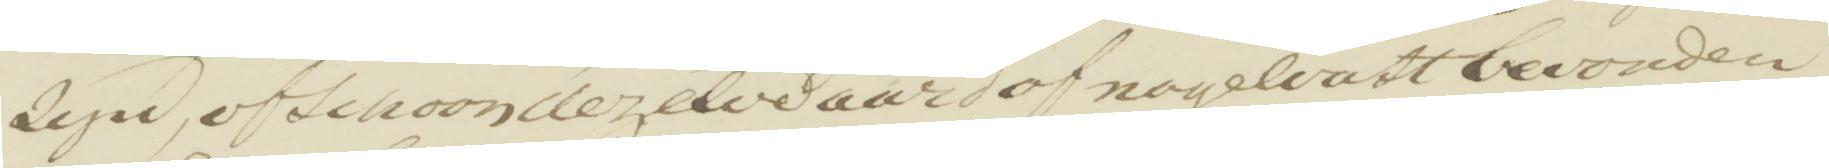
zyn, of schoon dezelve aard of nagelvast bevonden
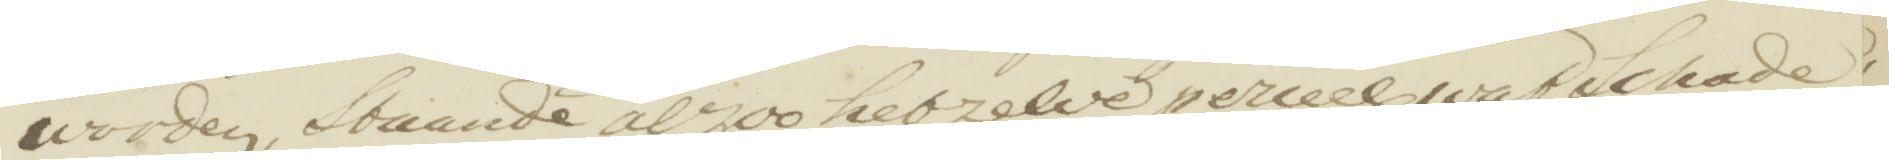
worden, staande alzoo hetzelve perceel wat schade
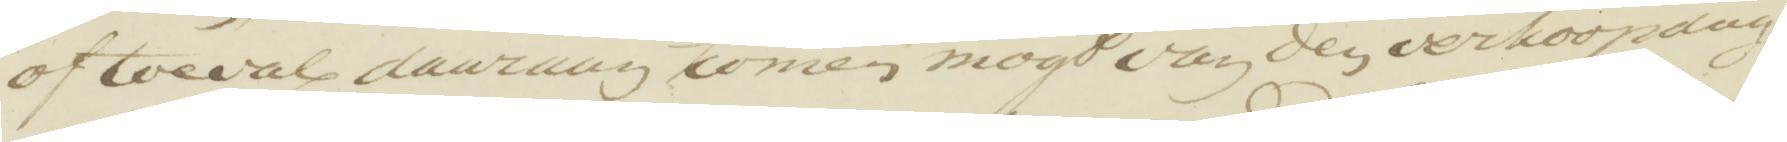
of toeval daaraan komen mogt van den verkoopdag,
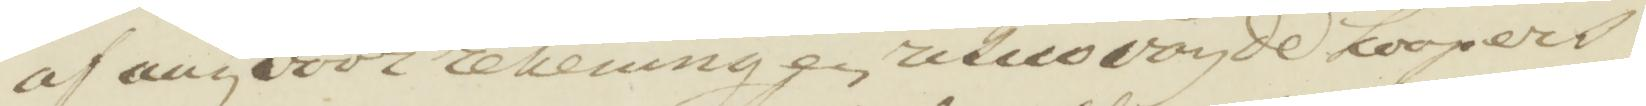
of aan voor rekening en risico vande koopers
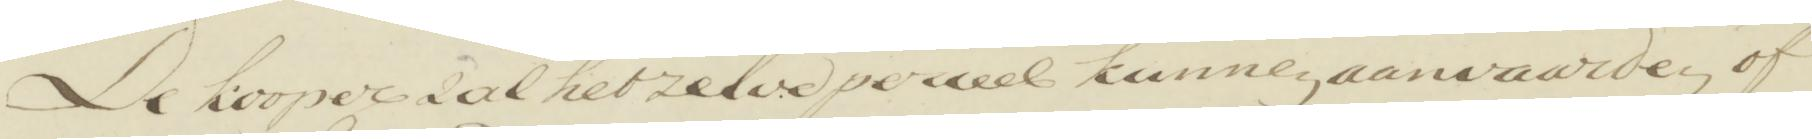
De kooper zal hetzelve perceel kunnen aanvaarden of
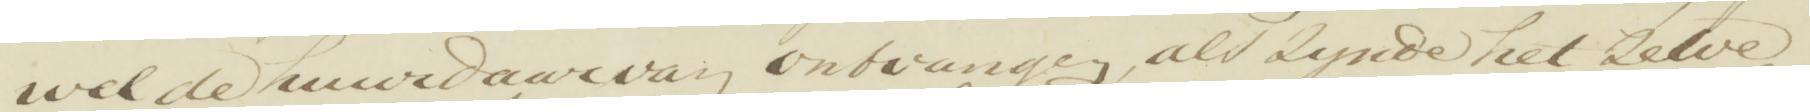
wel de huur daarvan ontvangen, als zynde het zelve
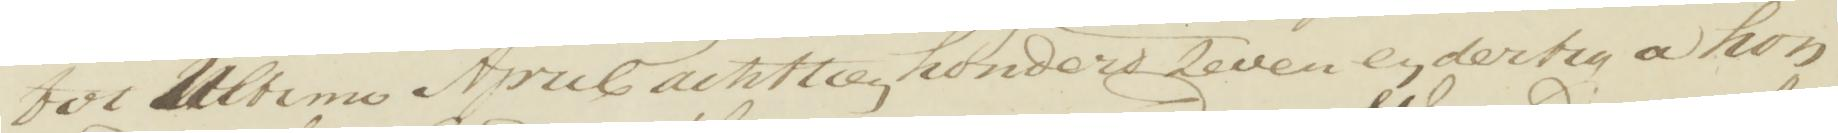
tot Ultimo April achttien honderd Zeven en dertig a hon
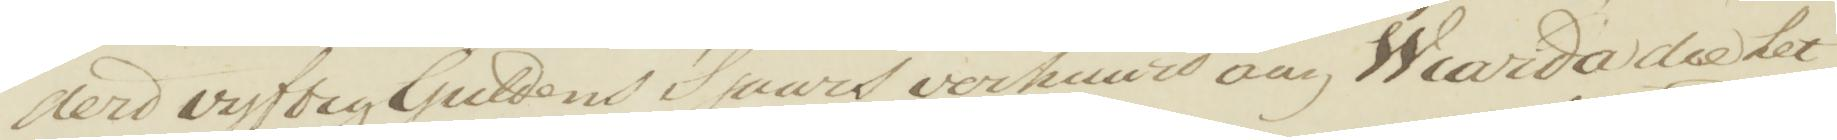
derd vyftig Guldens 's jaars verhuurd aan Wiarda die het
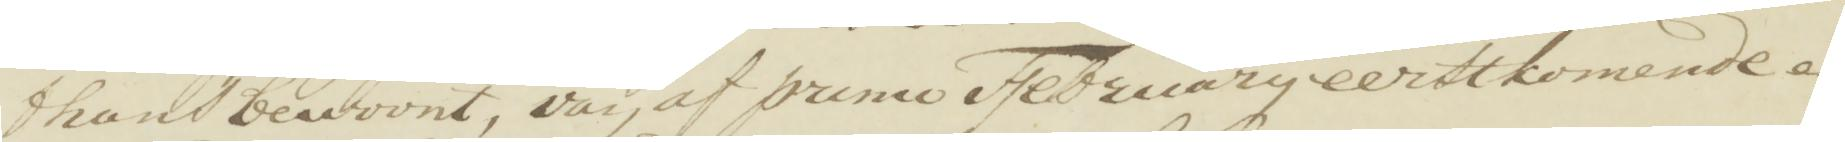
thans bewoont, van af primo February eerstkomende en
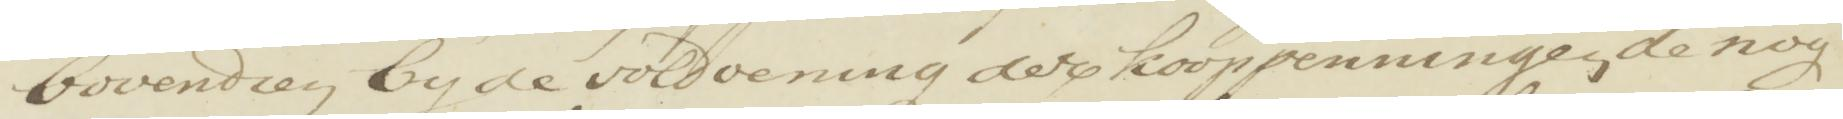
bovendien by de voldoening der kooppenningen de nog
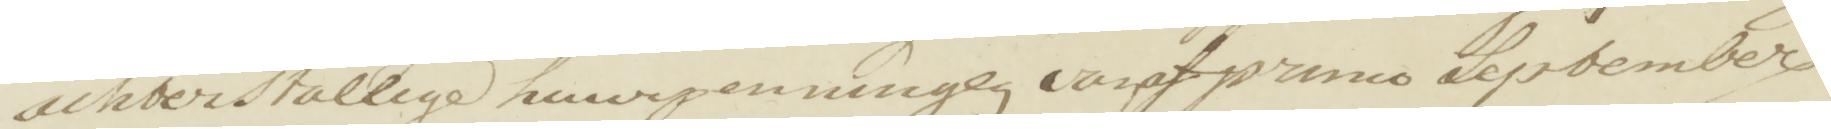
achterstallige huurpenningen vanaf primo September
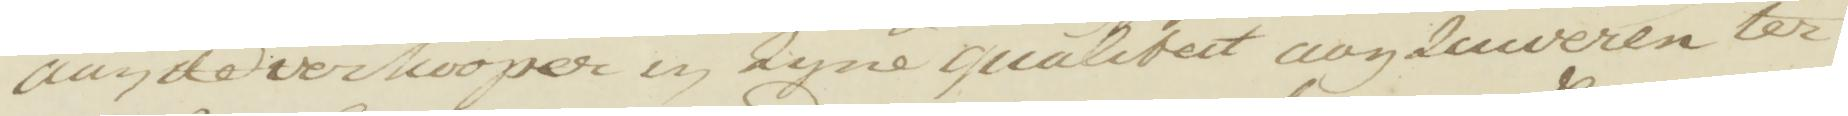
aan de verkooper in zyne qualiteit aanzuiveren ter
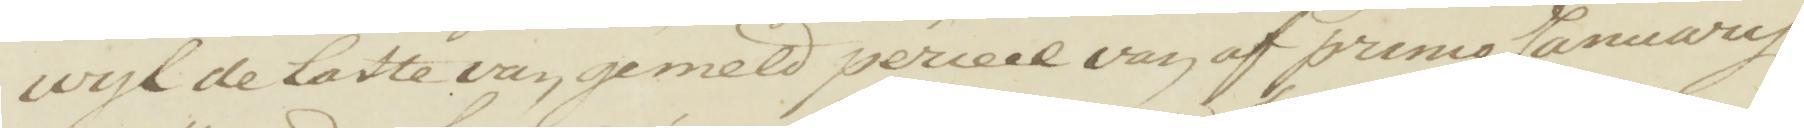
wyl de laste van gemeld perceel van af primo January
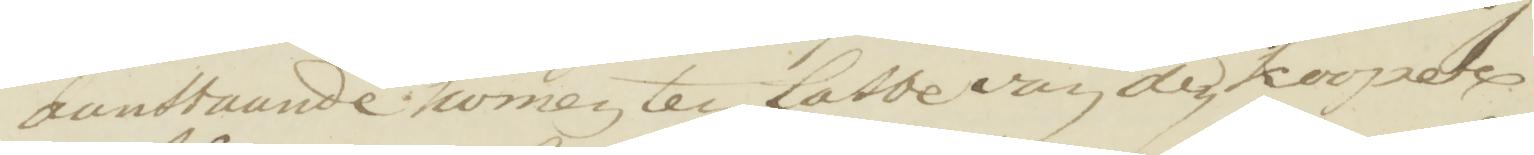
aanstaande komen ter laste van de kooper
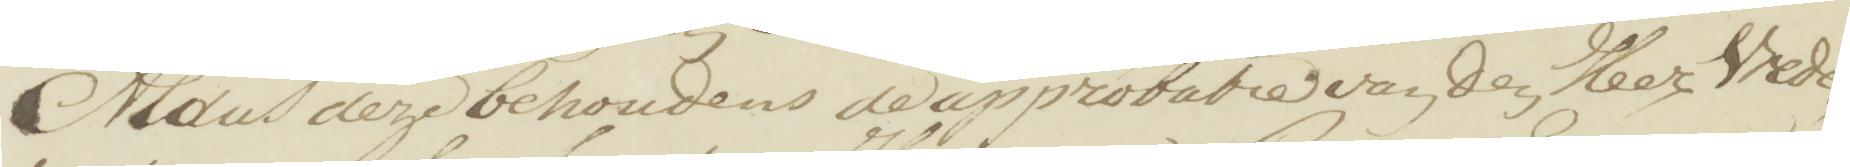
Aldus deze behoudens de approbatie van den Heer Vrede
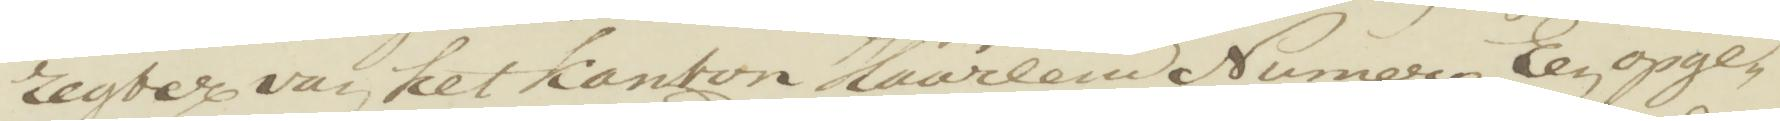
regter van het kanton Haarlem Numero Een opge„
